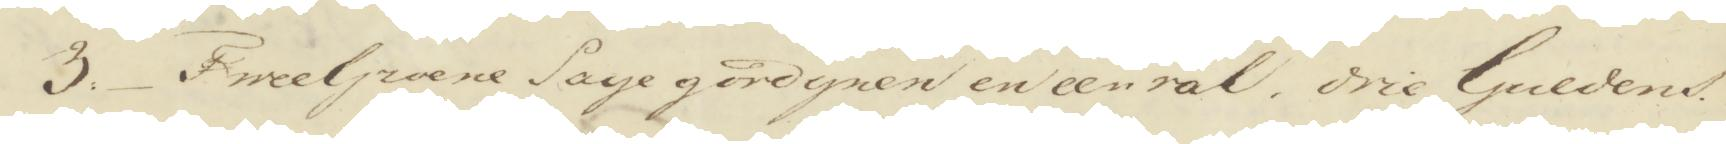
3: — Twee Groene saje gordynen en een val, drie Guldens.
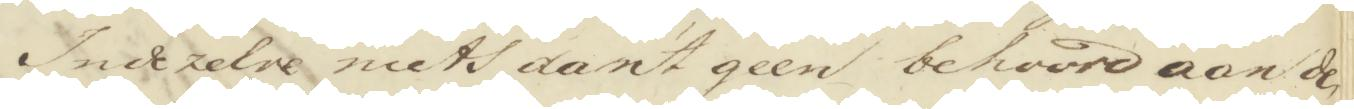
Indezelve niets dan’t geen behoord aan de
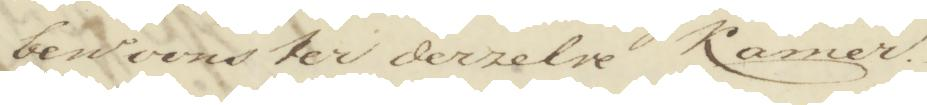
bewoonster derzelve Kamer.
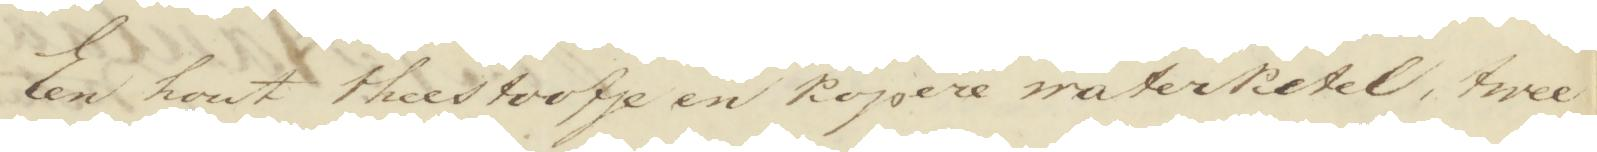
Een hout theestoofje en kopere waterketel, twee
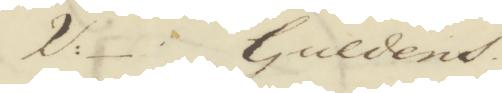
2:— Guldens.
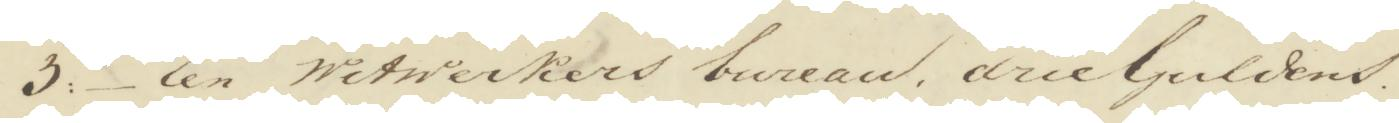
3:— Een witwerkers bureau, drie Guldens.
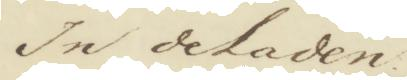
In de laden.
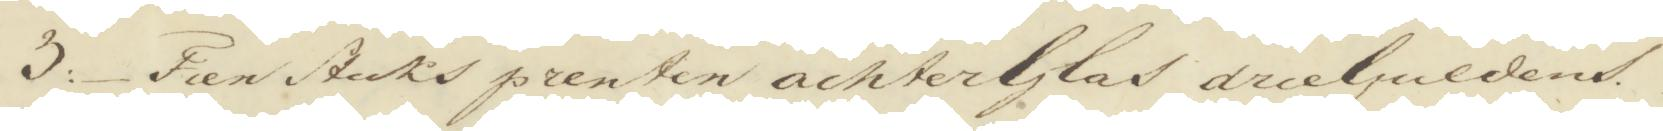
3:— Tien stuks prenten achter Glas drie Guldens.
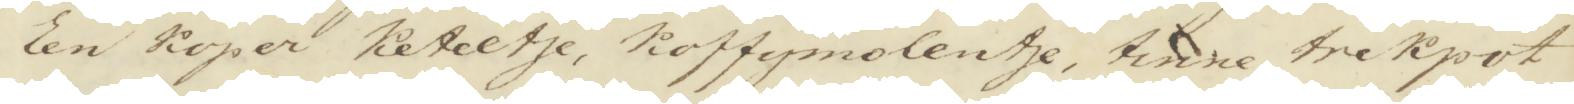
Een koper keteltje, koffymolentje, tinne trekpot
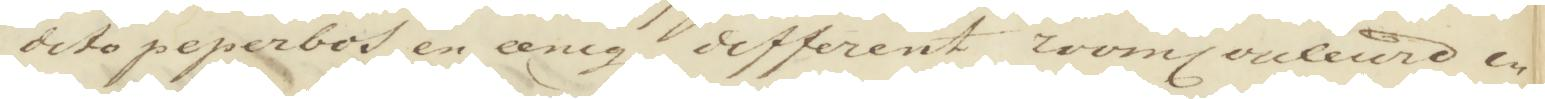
dito peperbos en eenig different roomcouleurd en
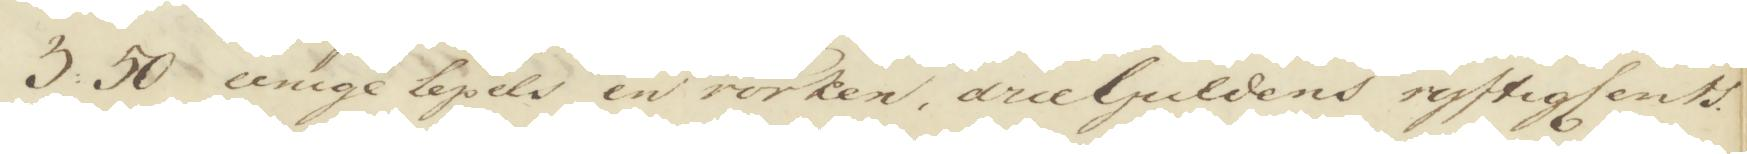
3: 50 eenige lepels en vorken, drie Guldens vyftigCents.
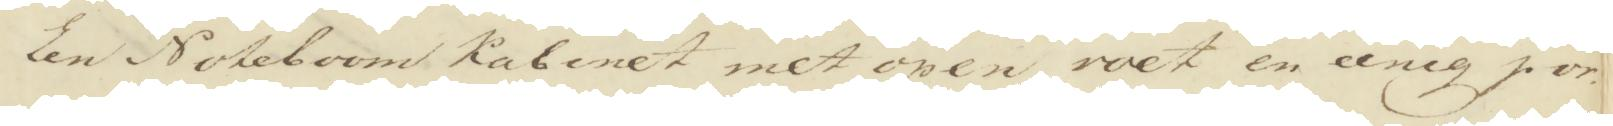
Een Noteboom kabinet met open voet en eenig por„
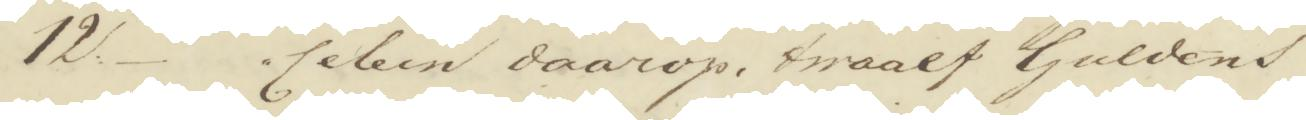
12:— „Celein daarop, twaalf Guldens
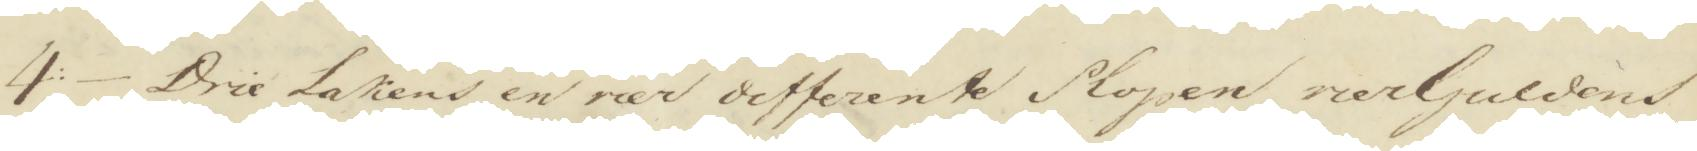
4: — Drie Lakens en vier differente slopen vier Guldens
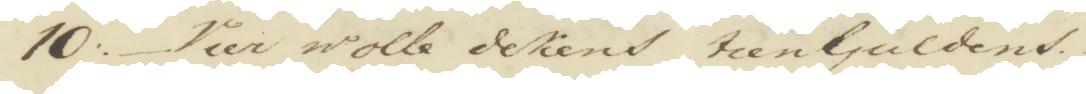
10: — Vier wolle dekens tien Guldens.
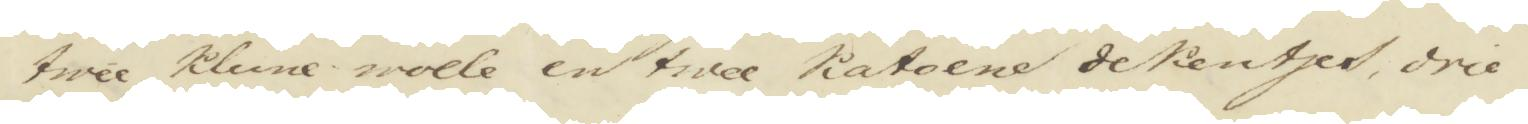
twee kleine wolle en twee katoene dekentjes, drie
